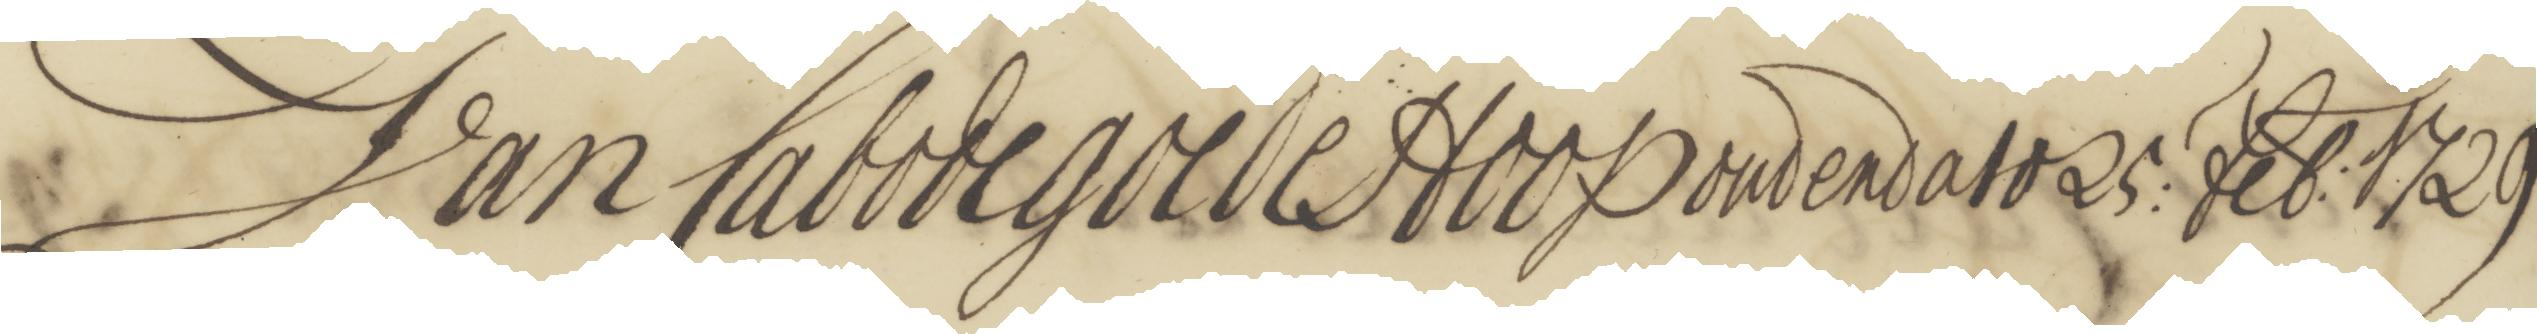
Van Cabodegoede Hoop onder dato 25:' feb: 1729
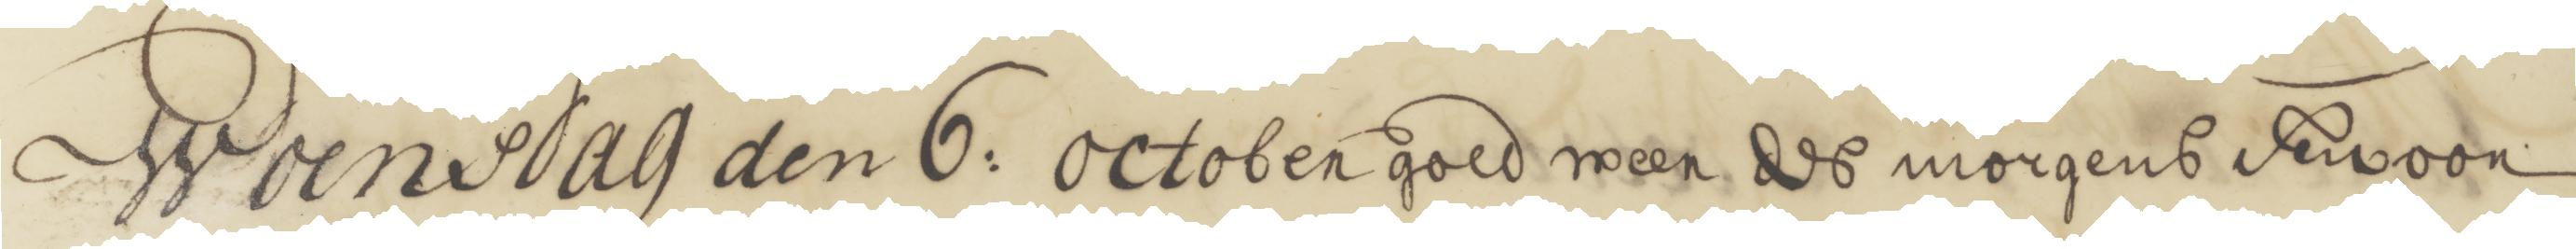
Woensdag den 6: october goed weer des morgens Envoor
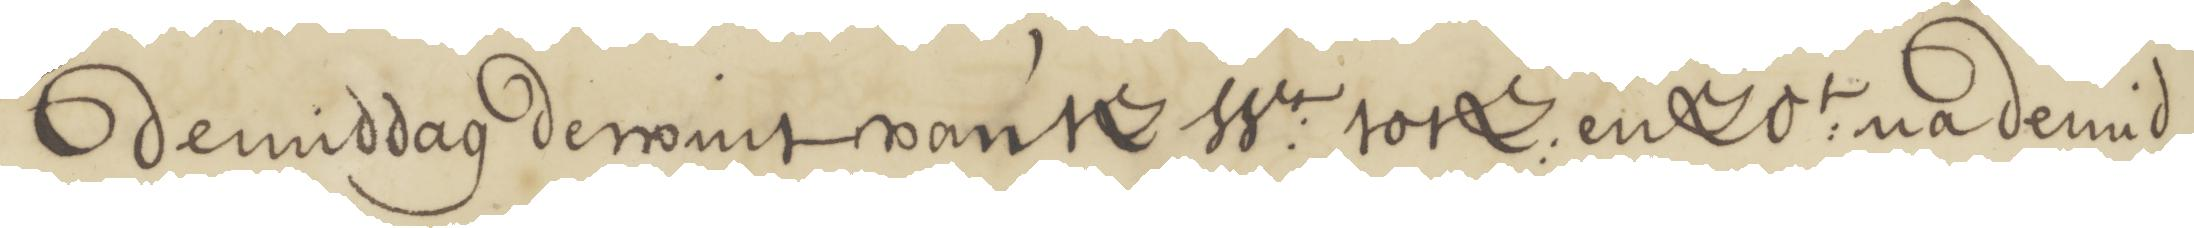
demiddag dewint van't Z W:t tot Z: en ZO:t na demid
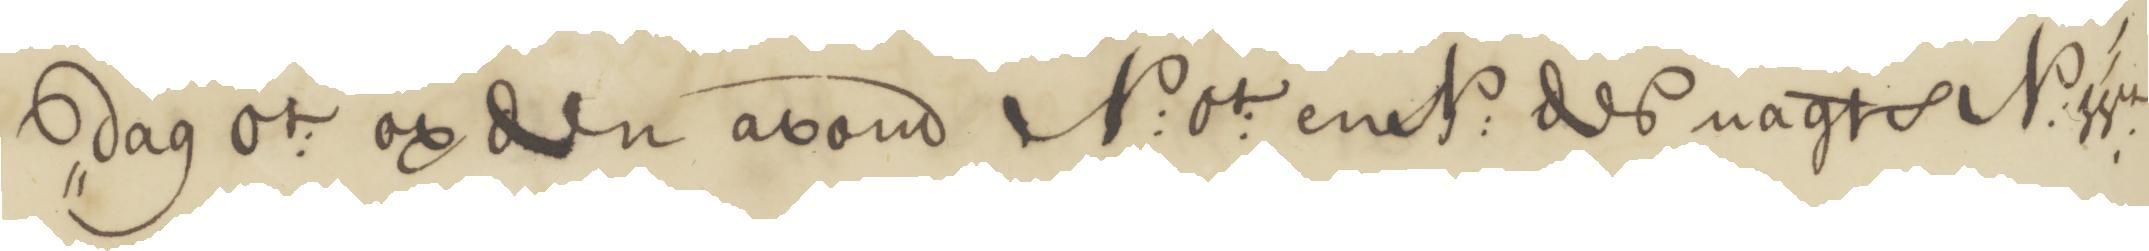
„dag o:t op den avond N: o:t en N: des nagts N: W:t
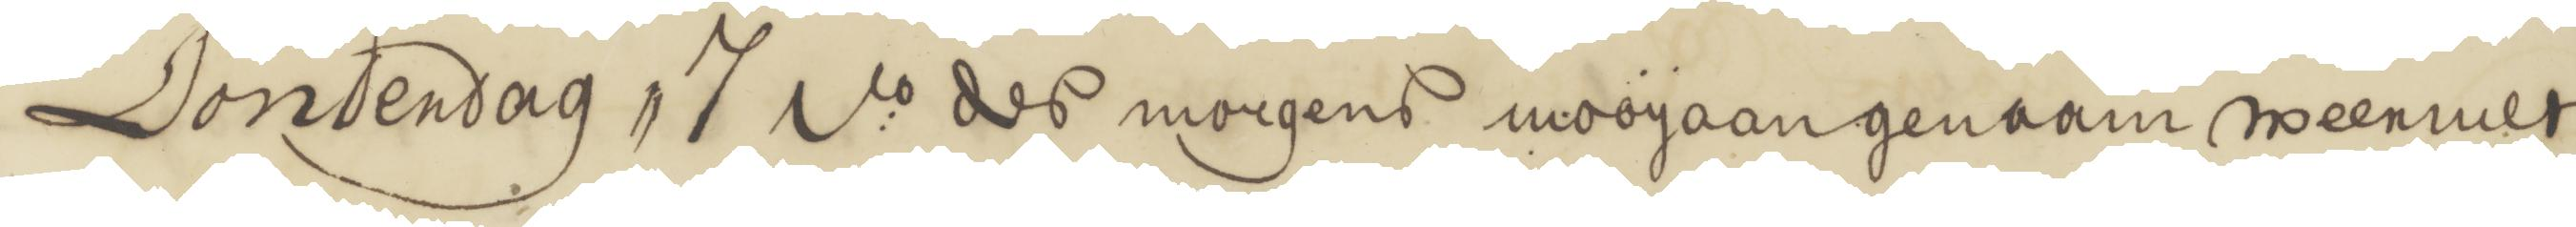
Donderdag „ 7 d:o des morgens mooij aangenaam weermet
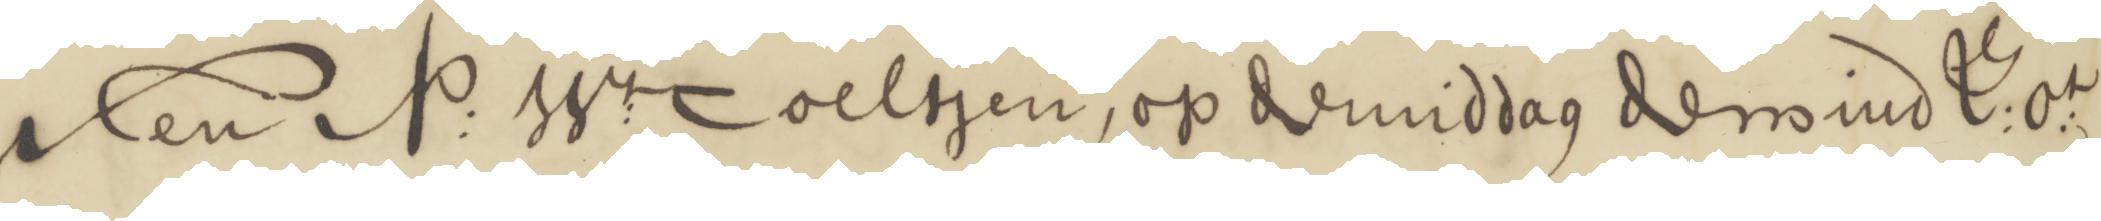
Een N: W:t coeltjen, op de middag de wind Z: o:t
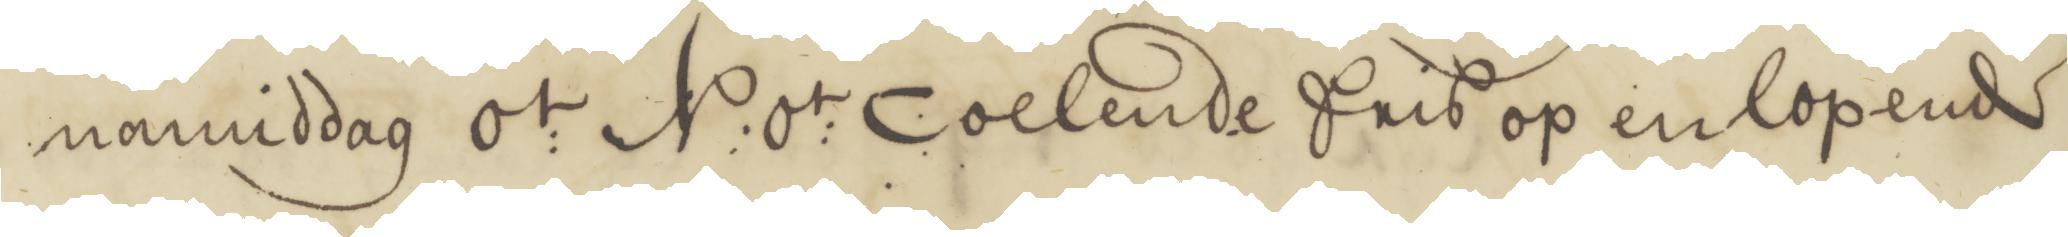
namiddag o:t N: o:t coelende fris op en lopende
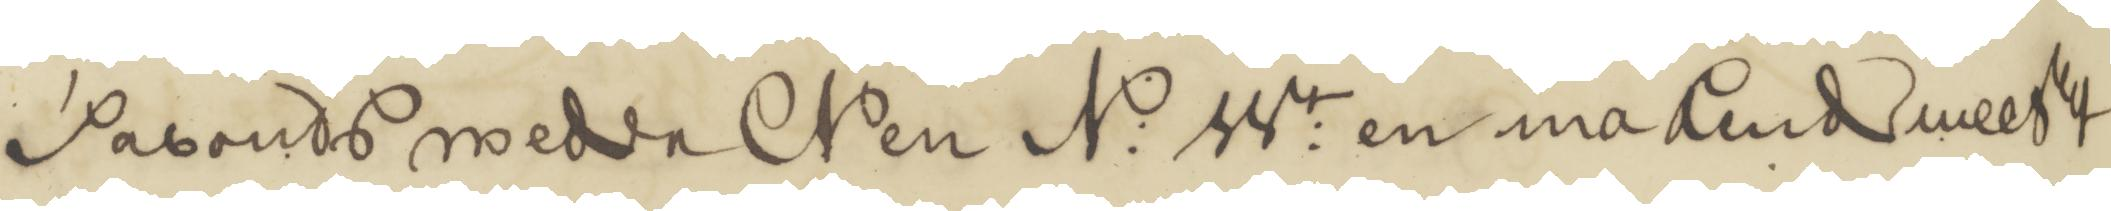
'savonds weder N en N: W:t en makende meest
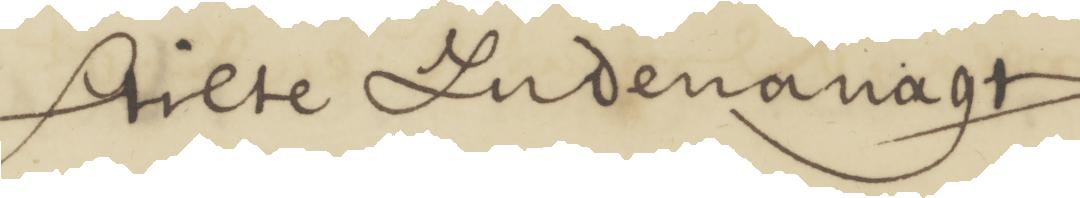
stilte Indenanagt
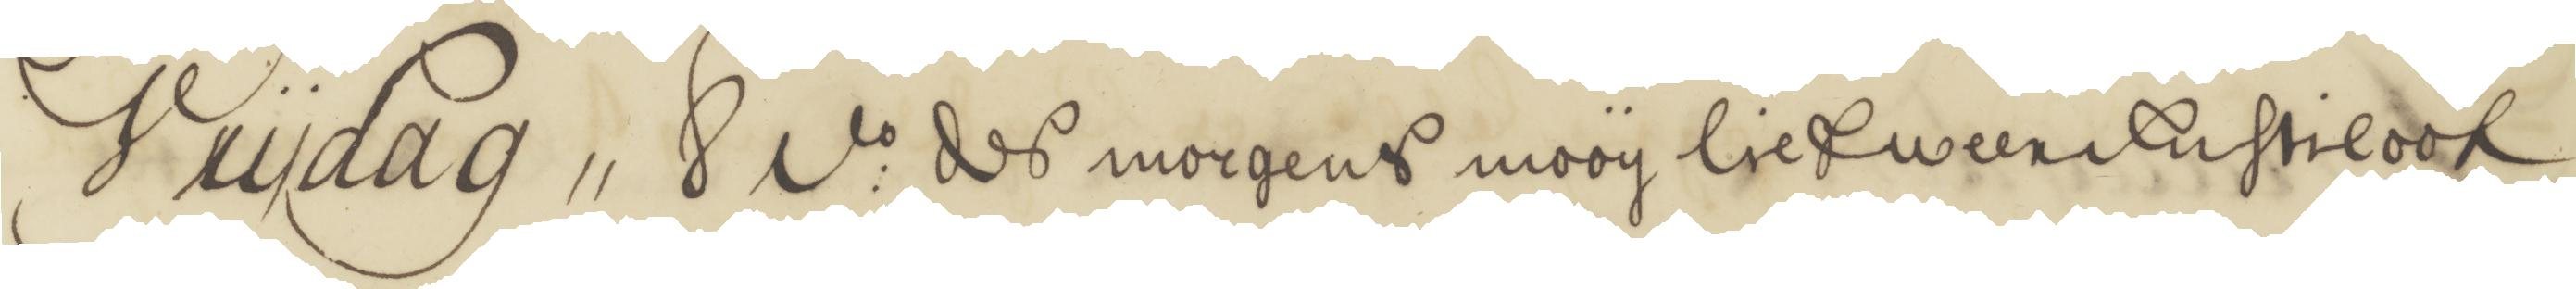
Vrijdag „ 8 d:o des morgens mooij lief weer En stil ook
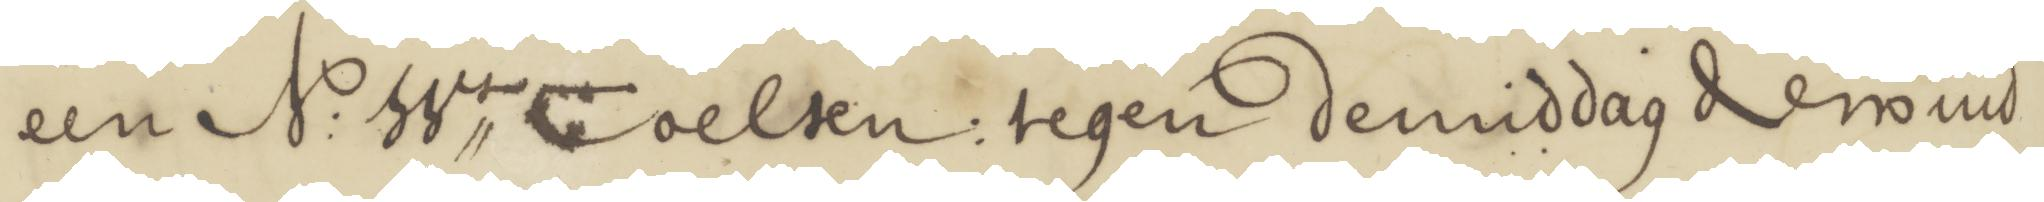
een N: W„t coelten: tegen de middag dewind
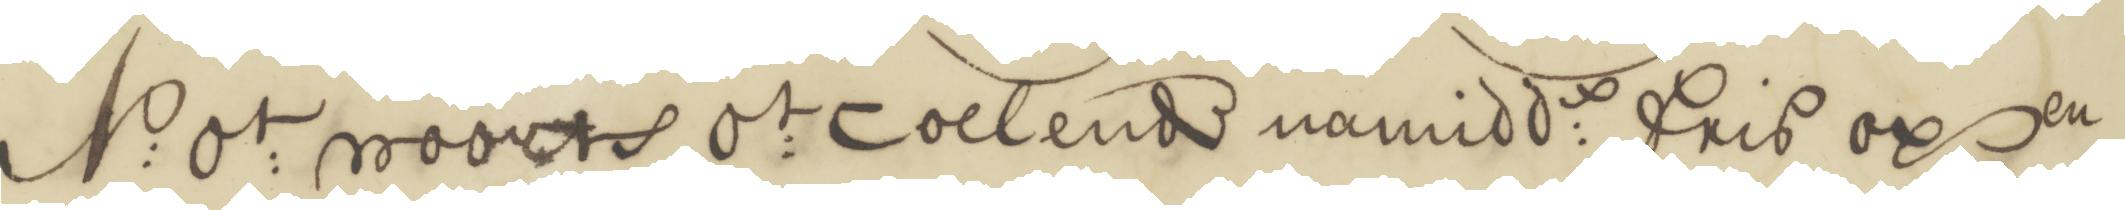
N: o:t voorts o:t coelende namidd:s fris op en
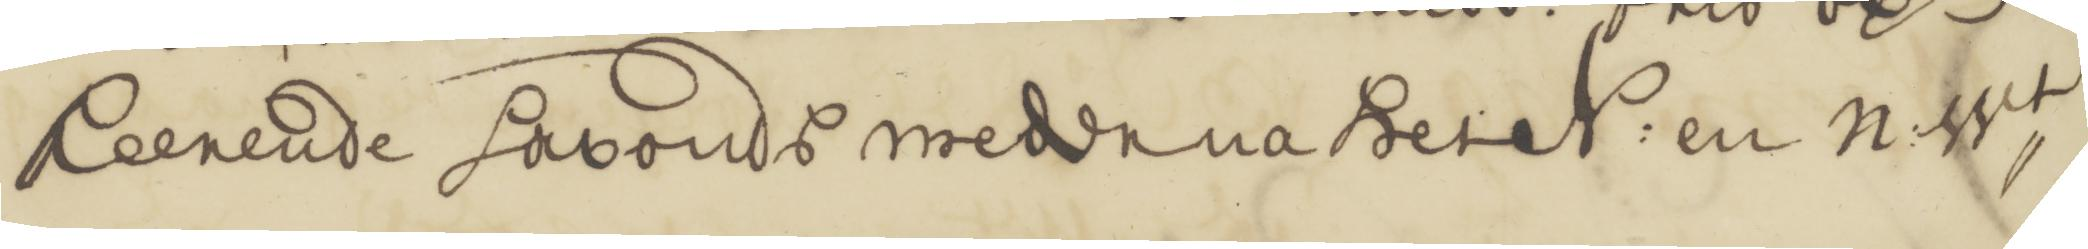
keerende savonds weder na het N: en n: W„t
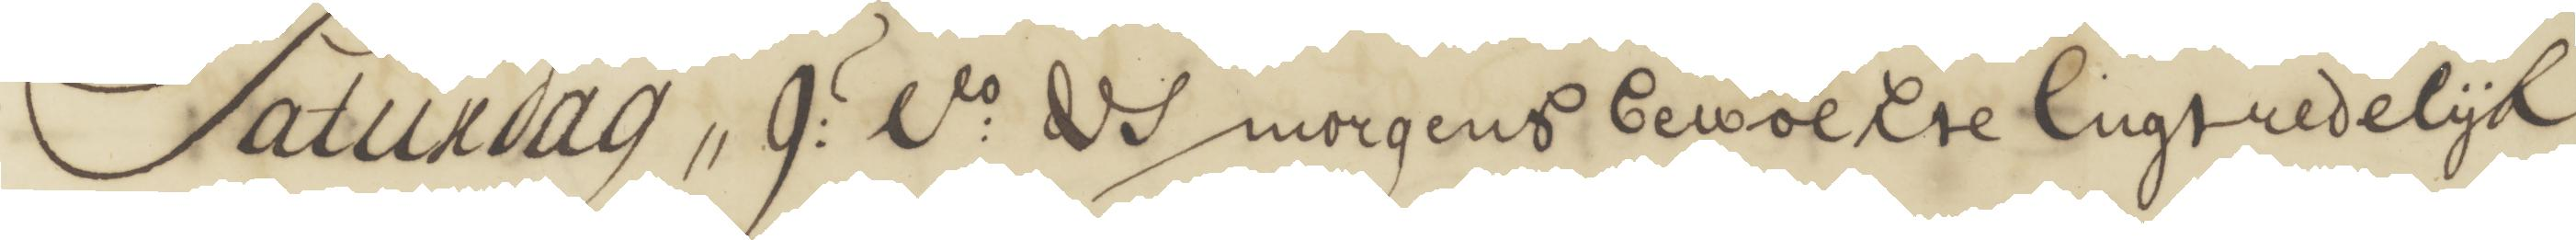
Saturdag „ 9:' d:o des morgens bewolkte lugt redelijk
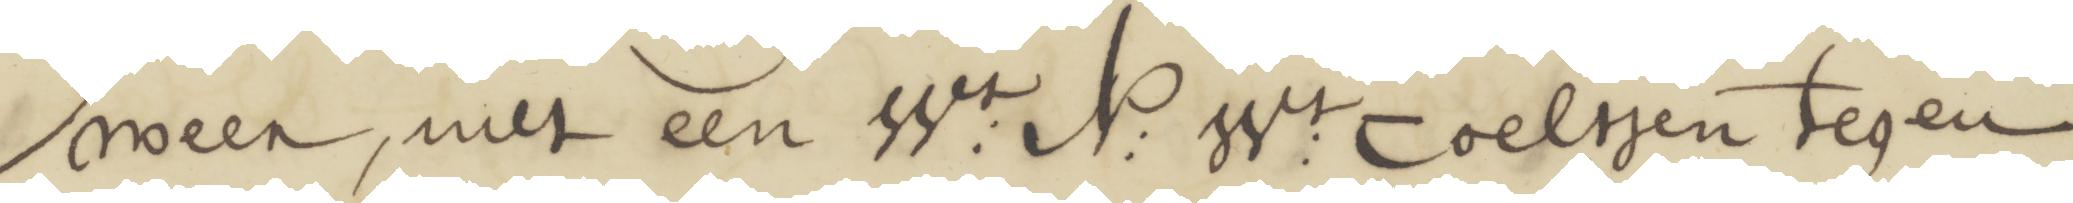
weer, met een W:t N. W:t coeltjen tegen
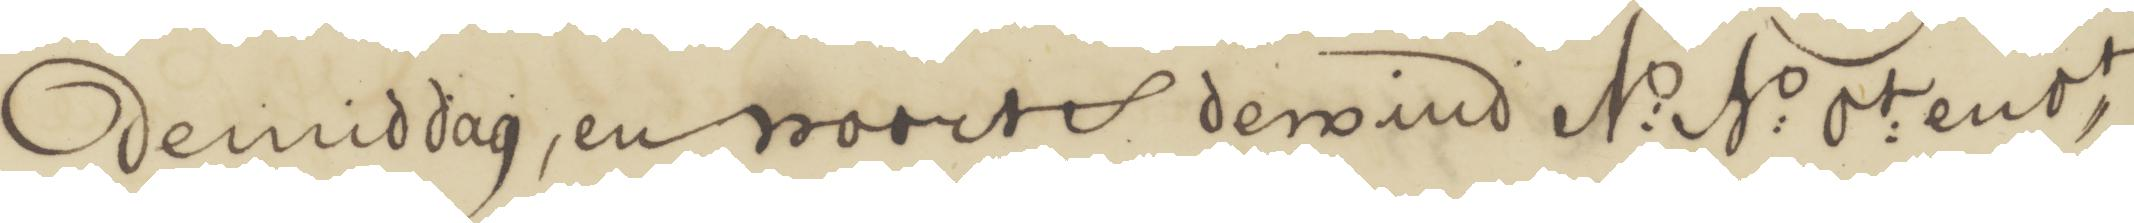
de middag, en voorts dewind N: N: o:t en o„t
